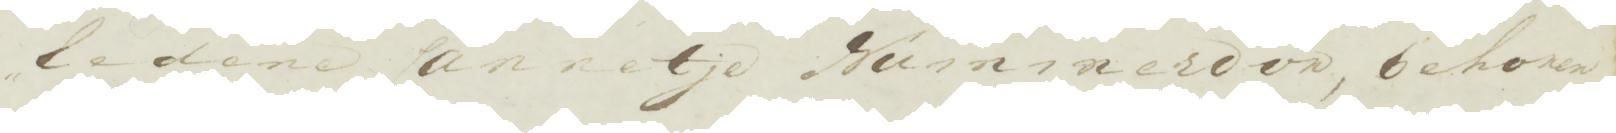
„ledene Jannetje Nummerdor, behoren
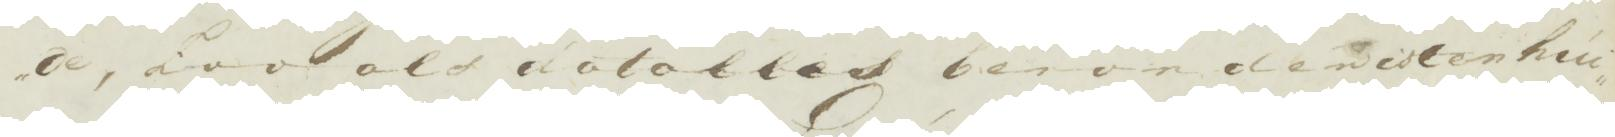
„de, Zoo als dat alles bevonden is ten hui„
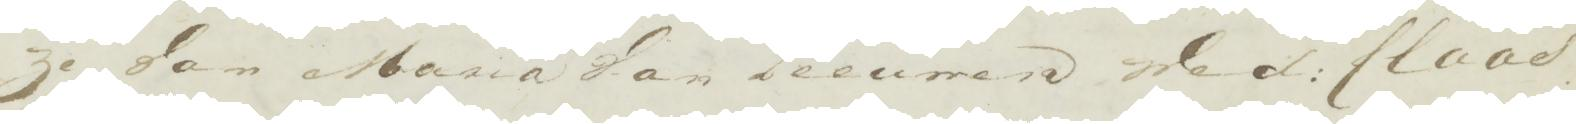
ze Van Maria van Leeuwen wed: Claas
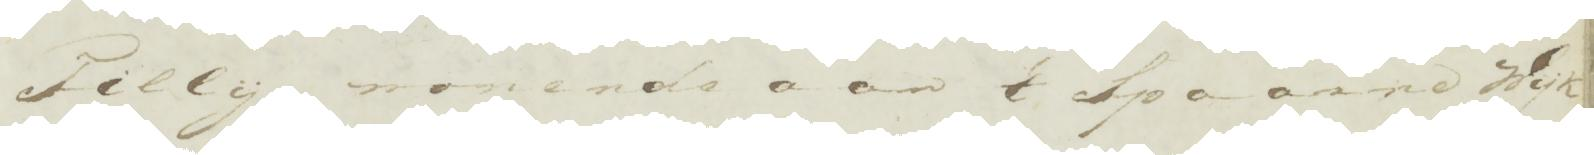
Tillij, wonende aan ’t Spaarne Wijk
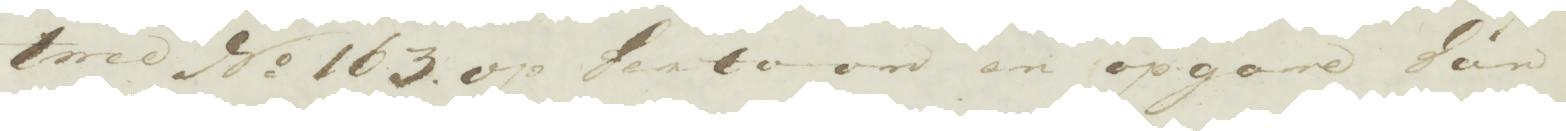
twee N=o 163. op Vertoon en opgave Van
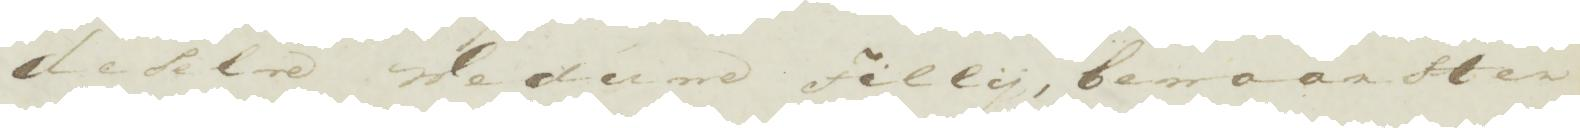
deselve weduwe Tillij, bewoonster
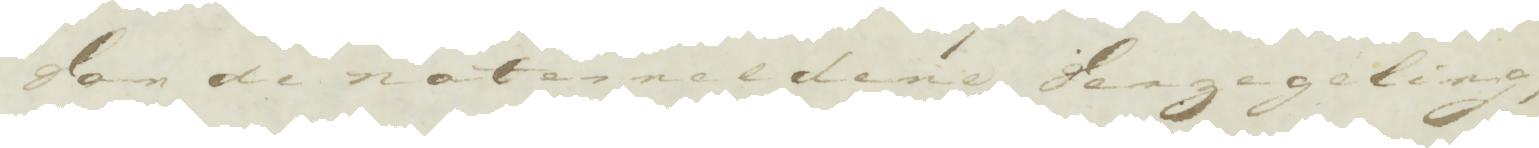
van de na te meldene Verzegeling,
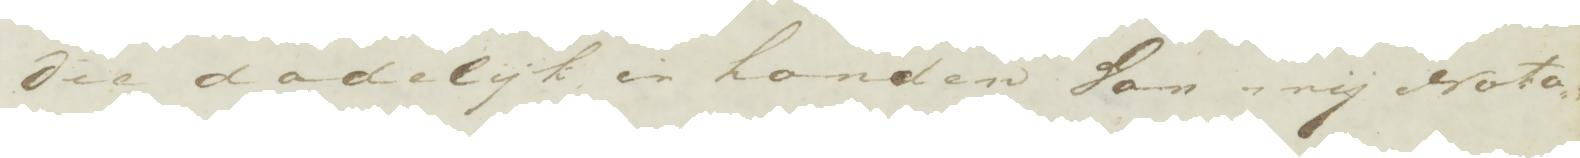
die dadelijk in handen Van mij Nota„
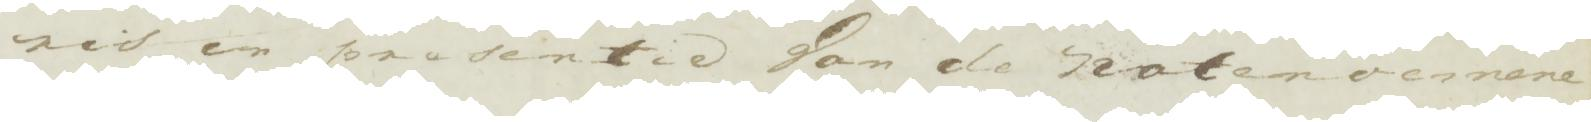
ris in presentie Van de natenoeme
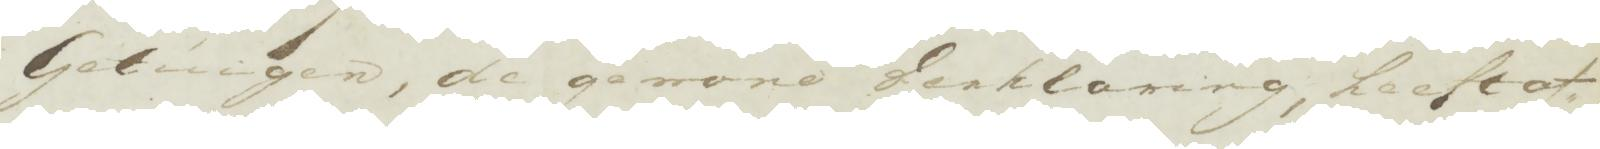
Getuigen, de gewone Verklaring, heeft af„
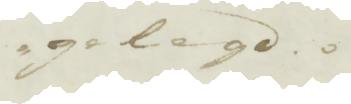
„gelegd.
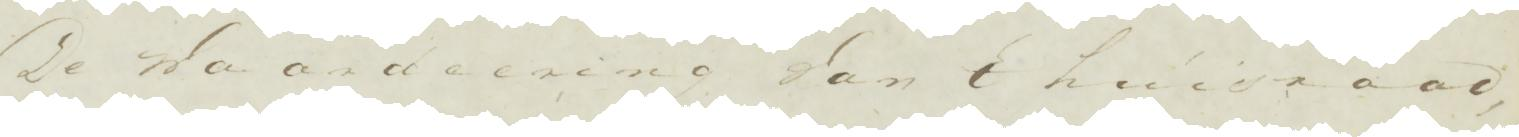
De Waardering, Van ’t huisraad,
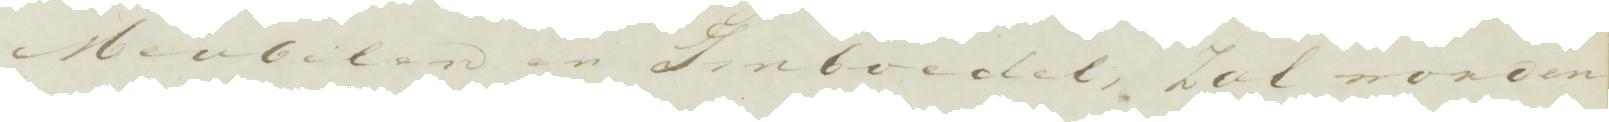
Meubelen en Imboedel, Zal worden
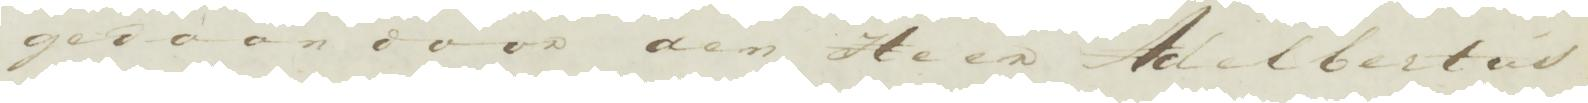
gedaan door den Heer Adelbertus
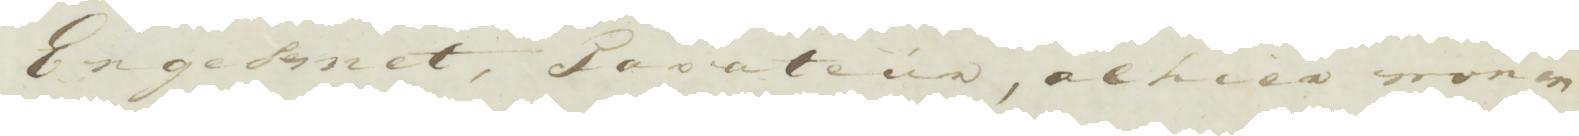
Engesmet Taxateur, alhier wonen
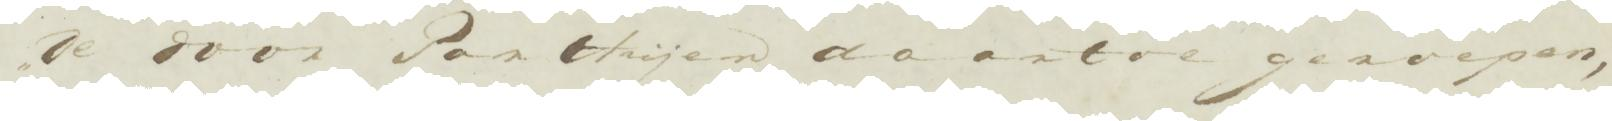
„de door Parthijen da artoe geroepen,
